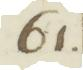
61.
